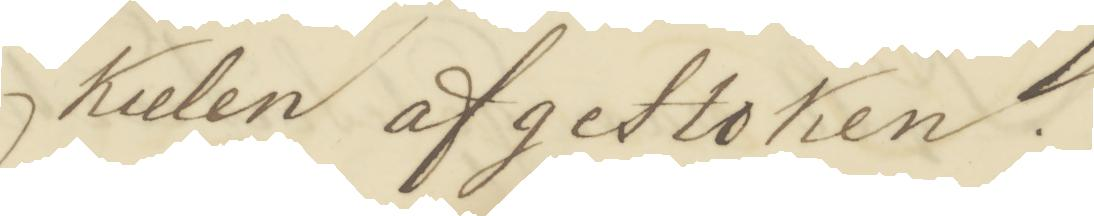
kielen afgestoken.
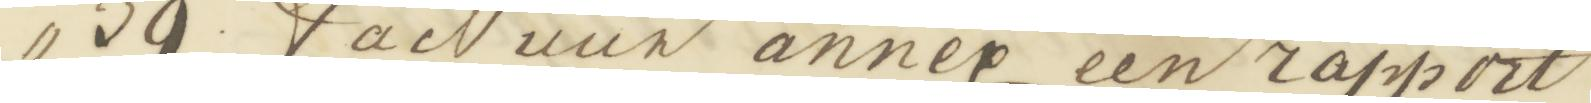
„39. factuur annex een rapport
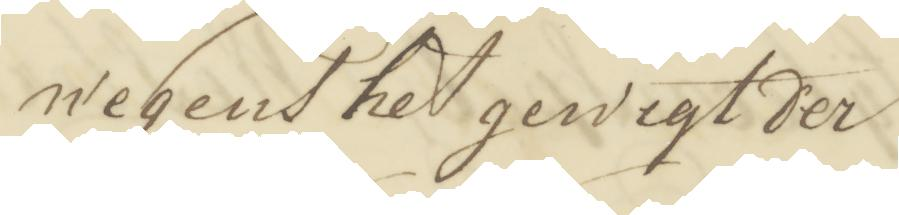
wegens het gewigt der}
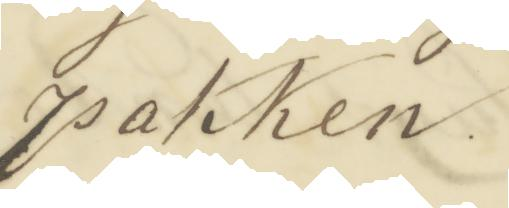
pakken.}
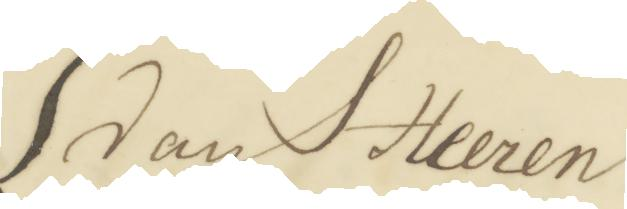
Van 'S Heeren
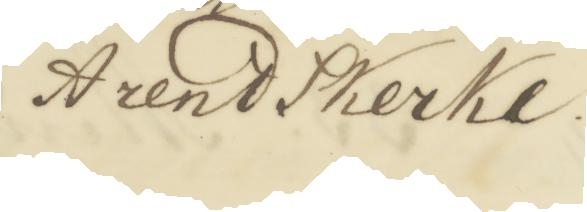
Arendskerke.
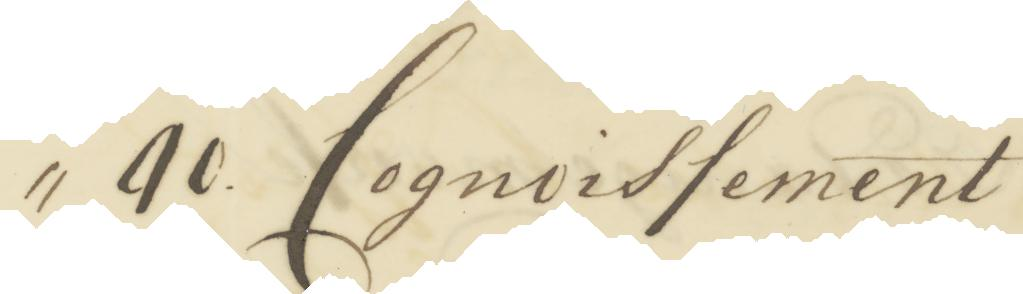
„ 40: Cognoissement
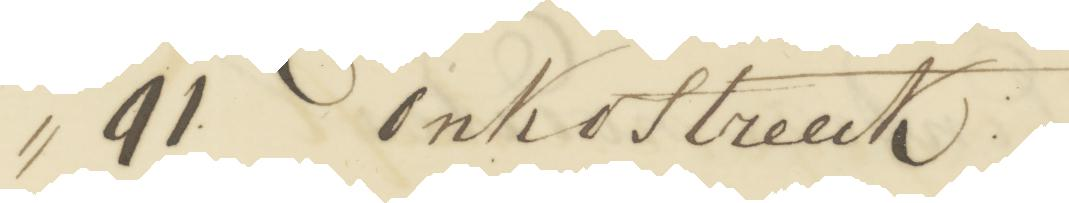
„ 41. onkostreeck:
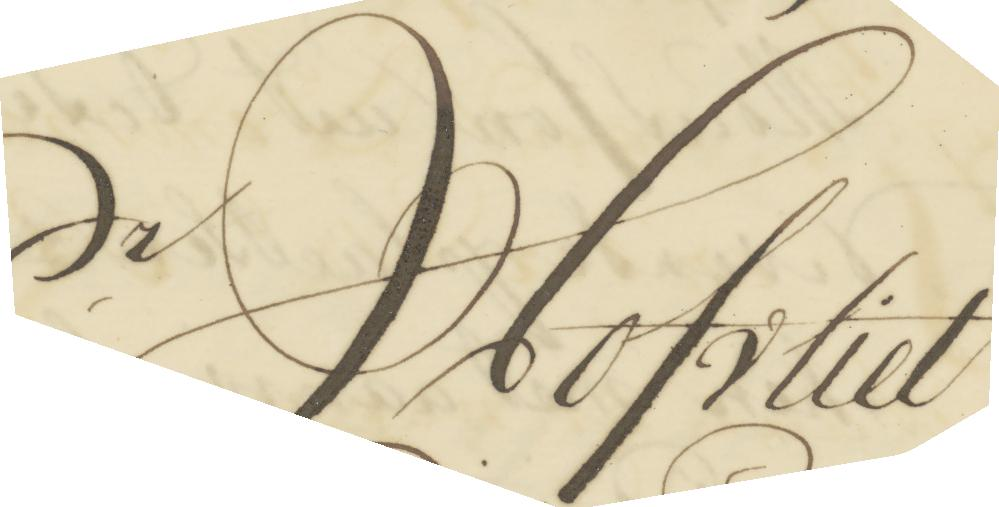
P:r Hofvliet
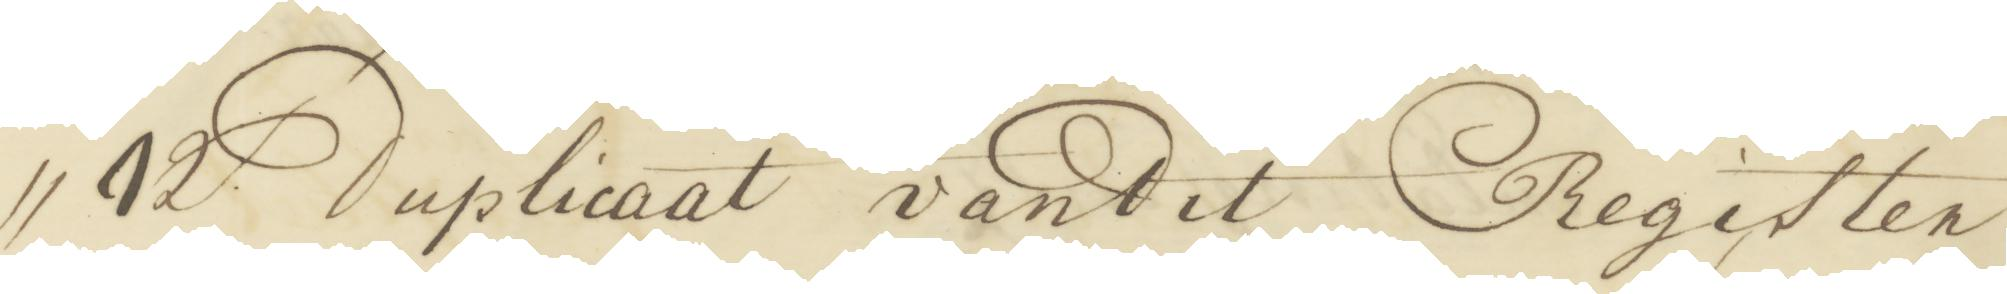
„42: duplicaat van dit Register
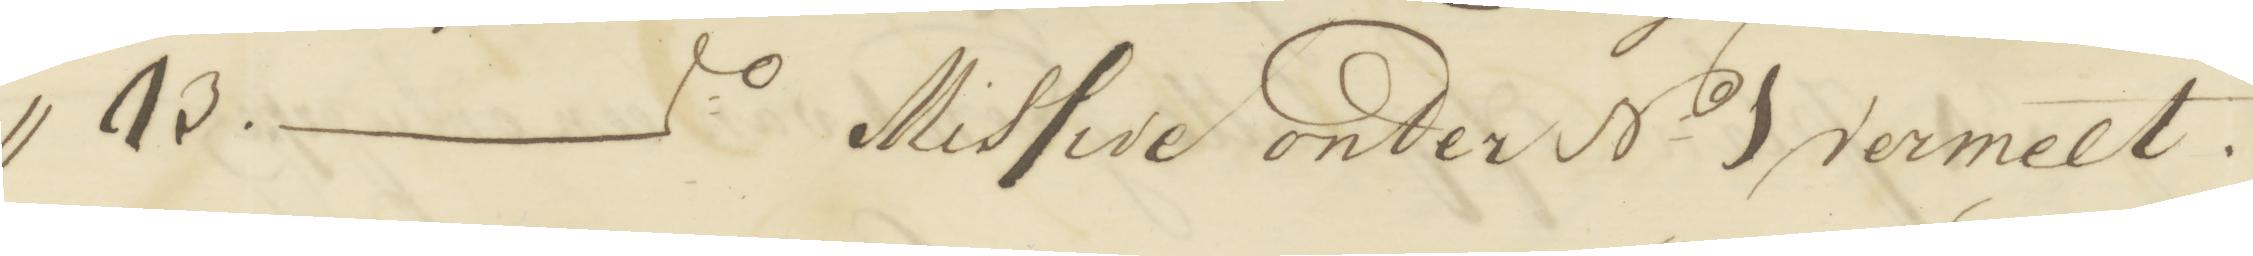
„ 43. —:o Missive onder N:o 1 vermelt.
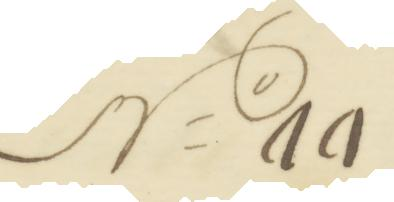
N=o 44
